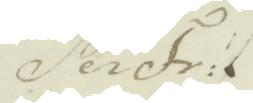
Per Fr:ƒ
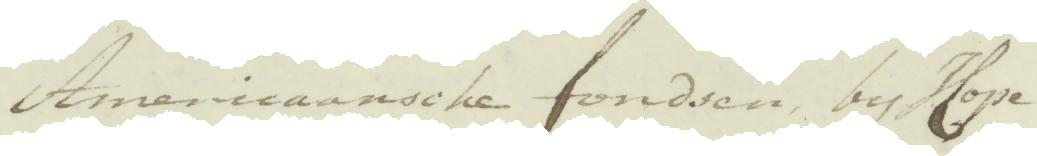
Amenicaansche fondsen, bij Hope
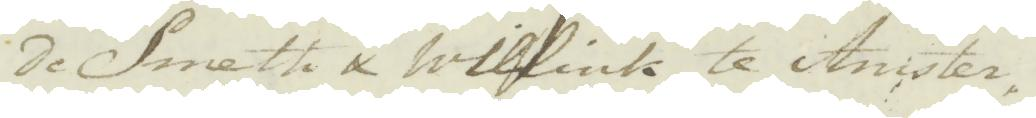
de Smeth & Willink te Amster„
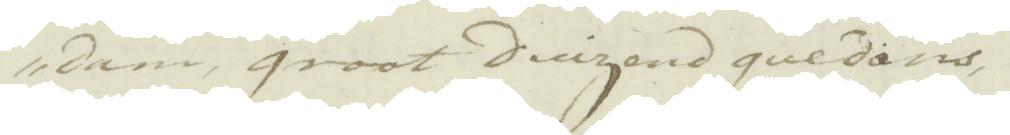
„dam, groot duizend guldens,
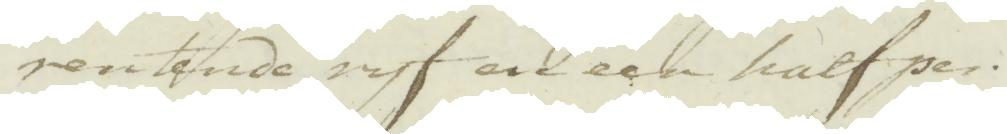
rentende vyf en een half per
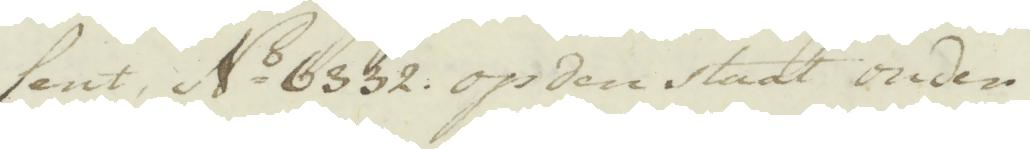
Cent, N=o 6332: op den staat onder
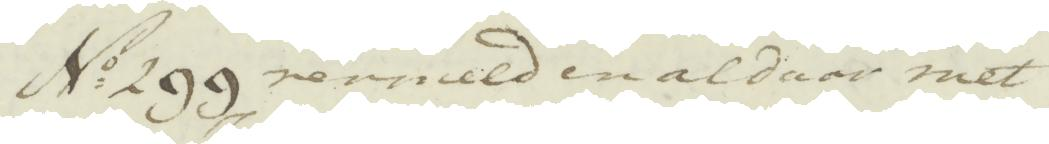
N=o 299 vermeld en aldaar met
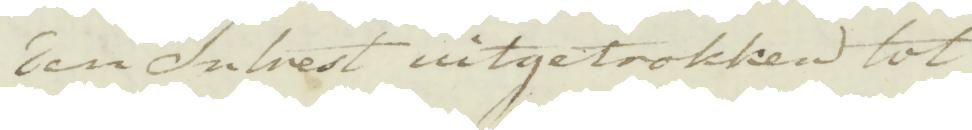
den Intrest uitgetrokken tot
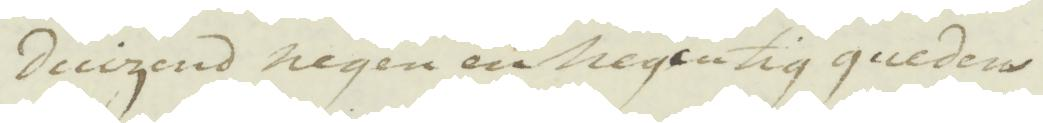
duizend negen en negentig guldens
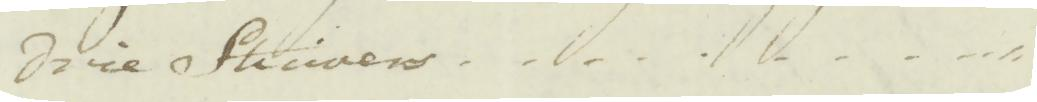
drie Stuivers . . . . . . . . . . „
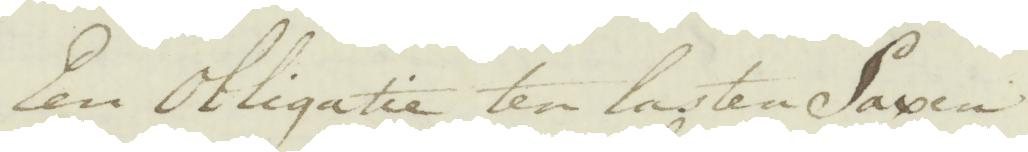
Een obligatie ten lasten Saxen
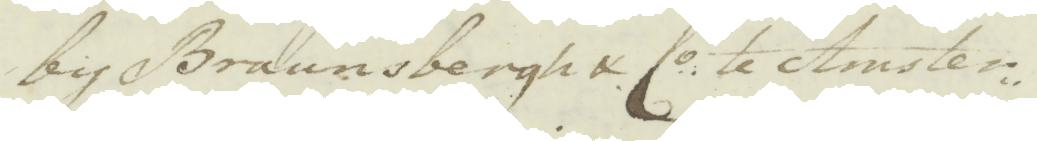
bij Braunsbergh & C:o te Amster„
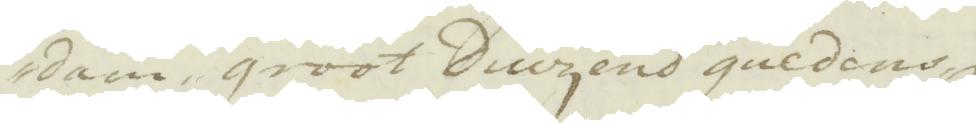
„dam „ groot duizend guldens
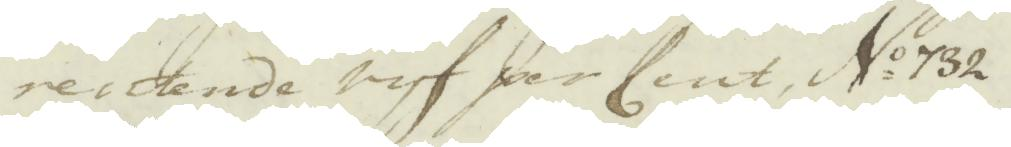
rentende vijf per Cent, N=o 732
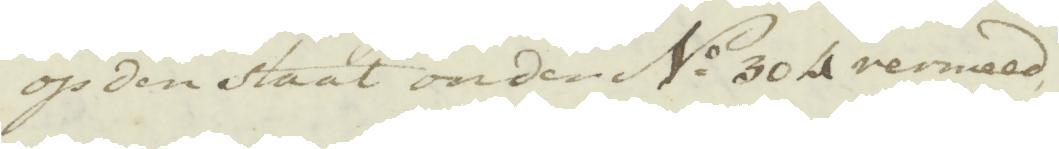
op den staat on der N=o 304 vermeld,
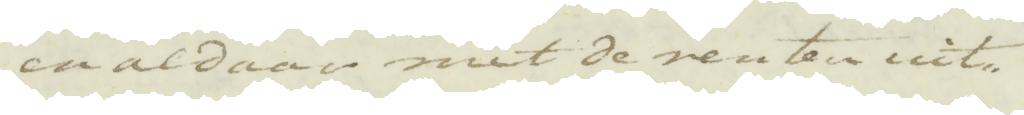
en aldaar met de renten uit„
